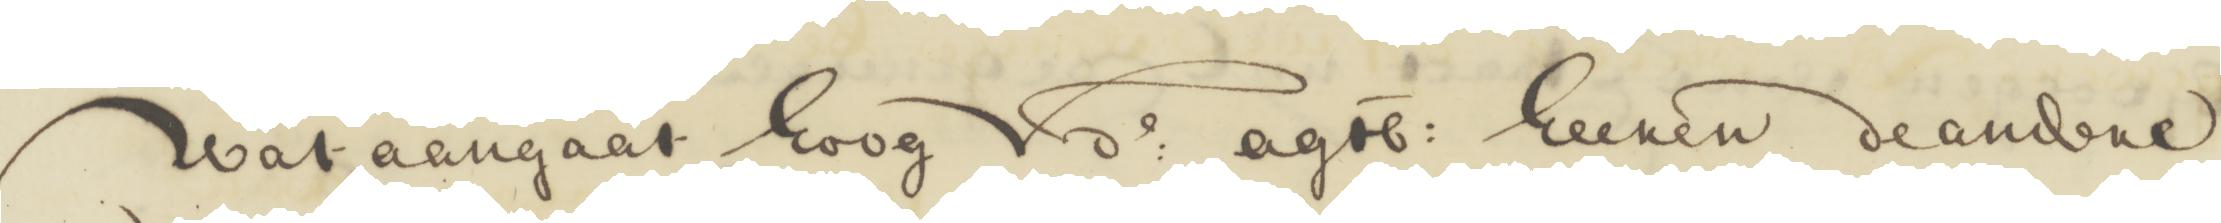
wat aangaat hoog Ed: agtb: heeren de andere
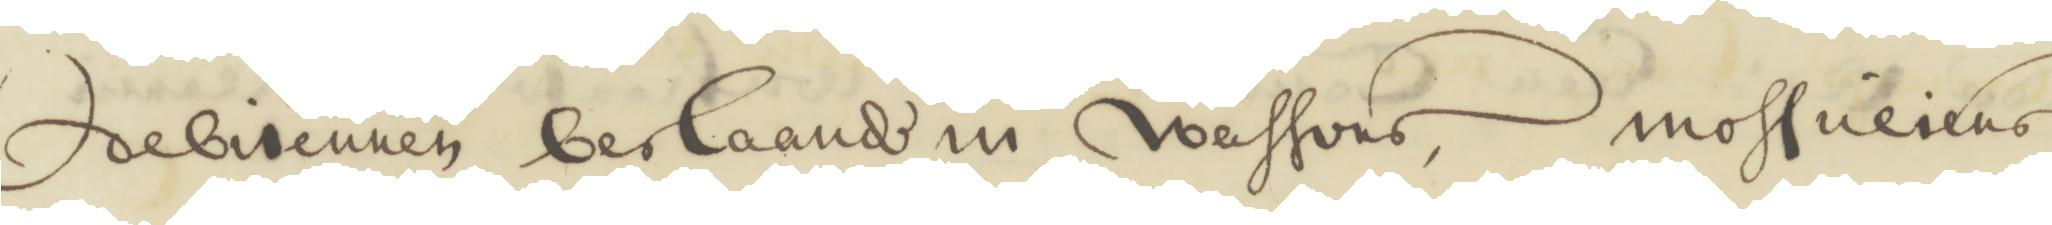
debiteuren bestaande in wassers, mossuliers
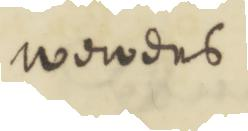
wewers
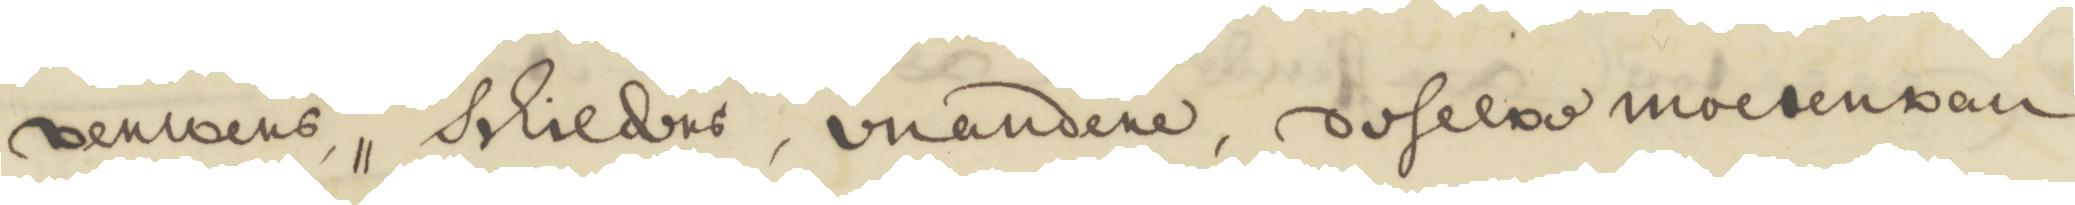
verwers, „ schilders, enandere, deselve moetenvan
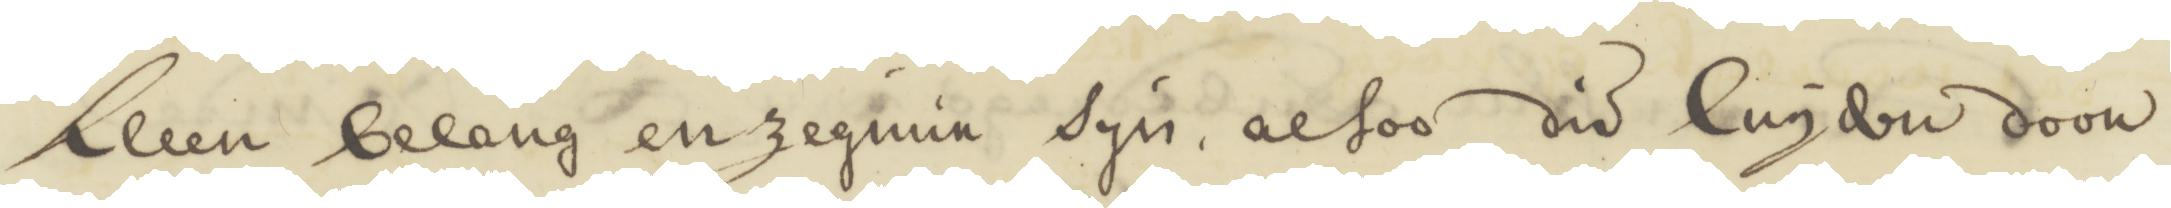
kleen belang en zeguur sijn, alsoo die luijden door
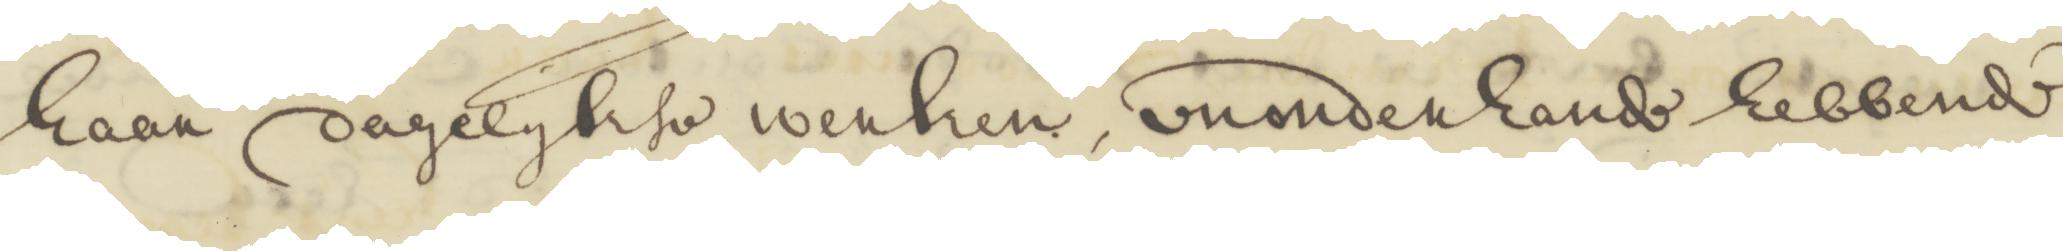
haar dagelijkse werken, enonderhande hebbende
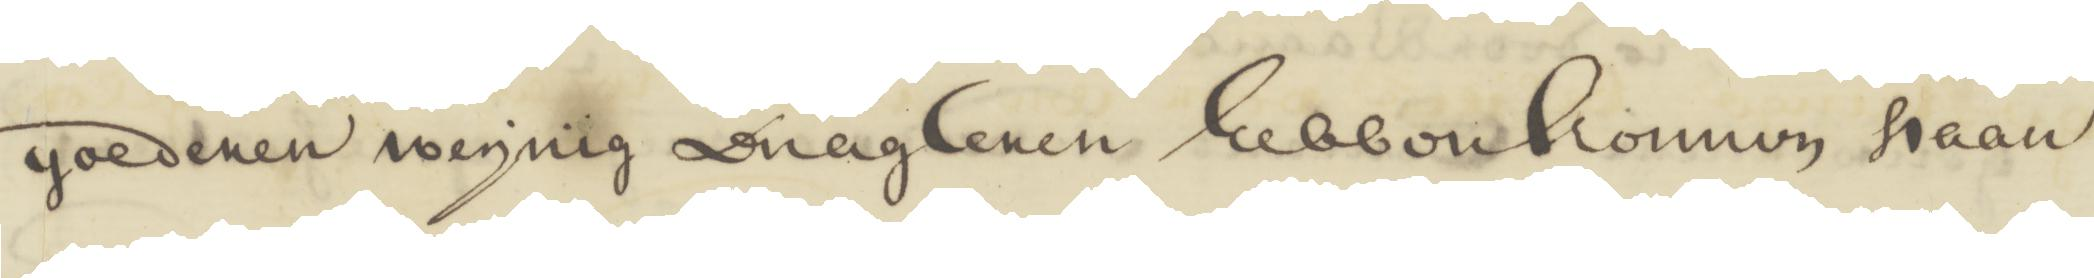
goederen weijnig tenagteren hebben konnen staan
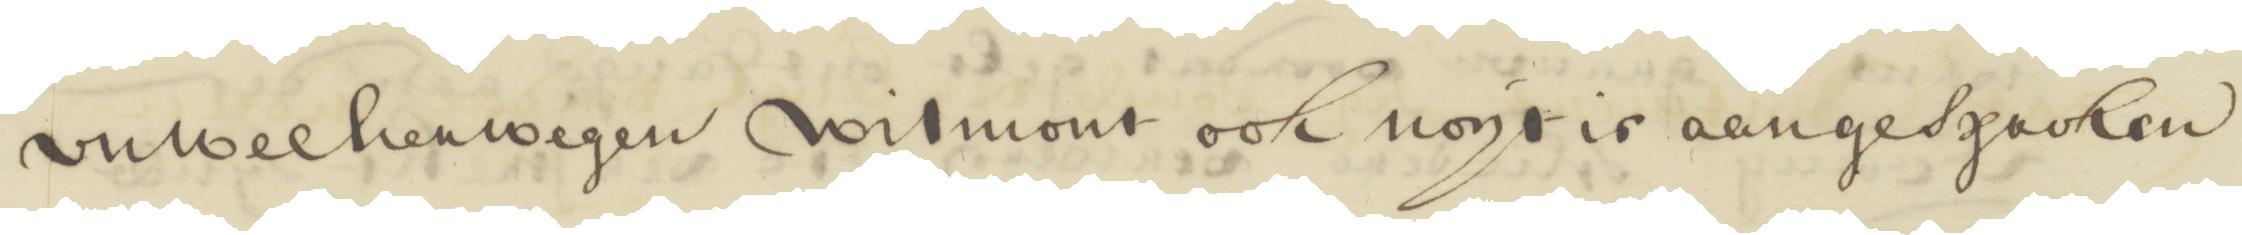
en welker wegen witmont ook noijt is aangesproken
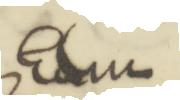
hem
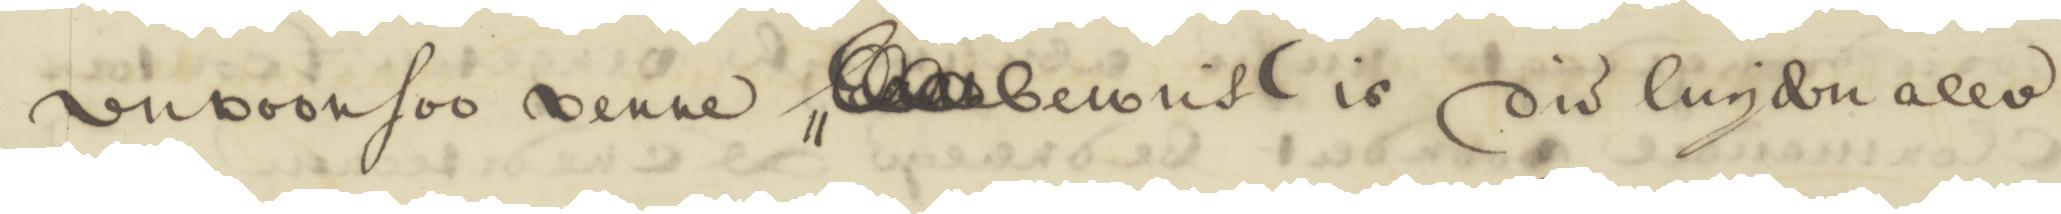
en voor soo verre „ haar bewust is die luijden alle
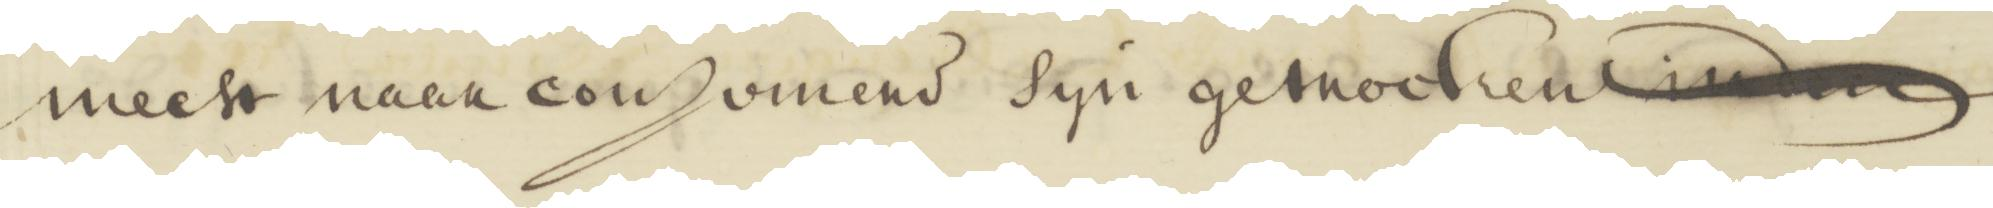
meest naar consemere sijn getrocken inden
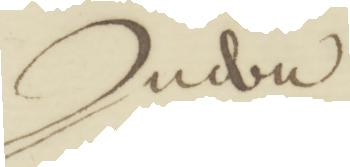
Jnder
